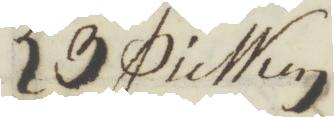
3 Piekken
